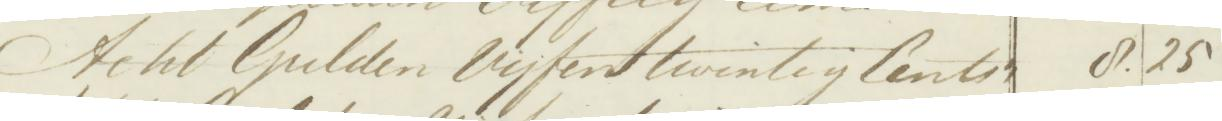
Acht Gulden Vijfen twintig Cents „ 8.25
